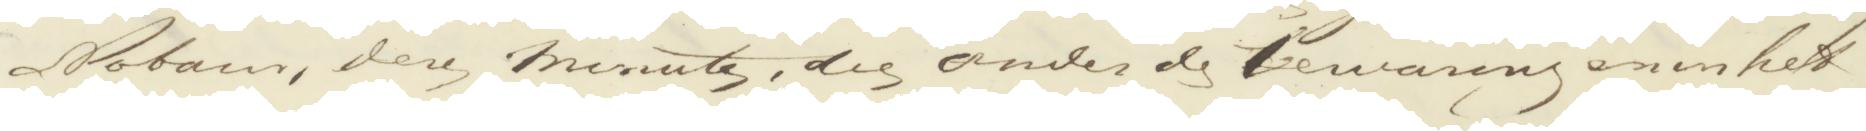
Notaris, deze minute, die onder de bewaring en in het
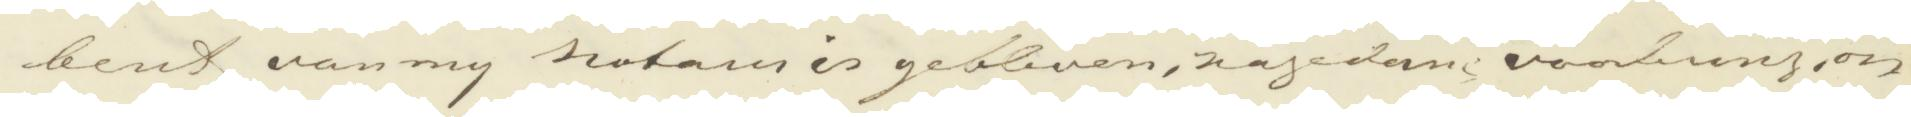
bezit van my notaris is gebleven, nagedane voorlezing, on
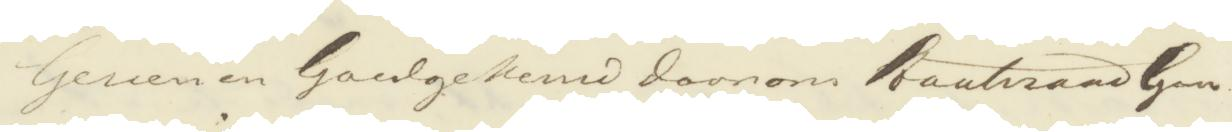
Gezien en Goedgekeurd door om Staatsraad Gou
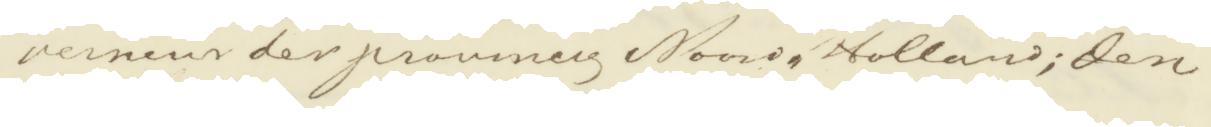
verneur der provincie Noord„ Holland; den
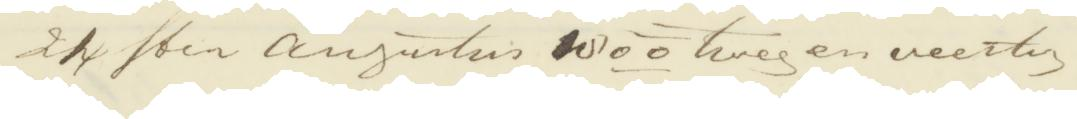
24 sten Augustus 1800 twee en veertig
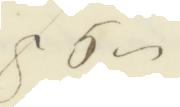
ƒ5-
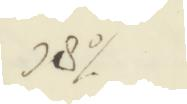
28%
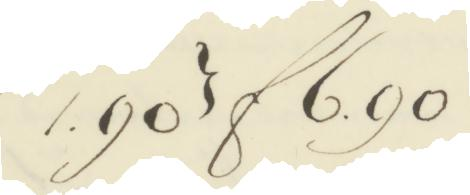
1.90 ƒ 6.90
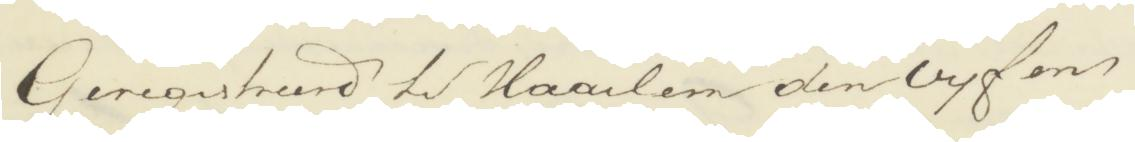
Geregistreerd te Haarlem den vijf en
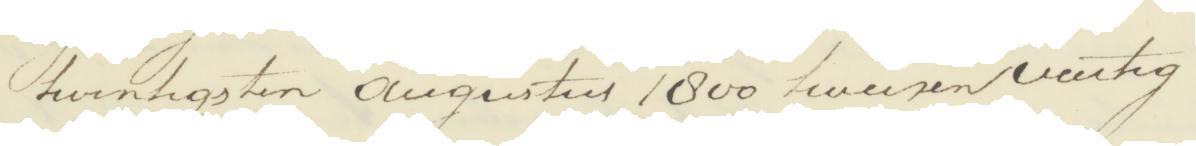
twintigsten Augustus 1800 twee en veertig
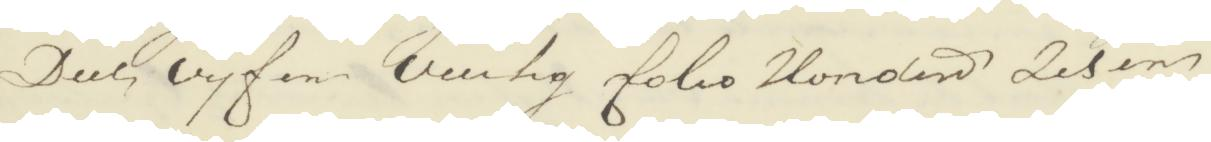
Deel vyf en Veertig folio Honderd Zes en
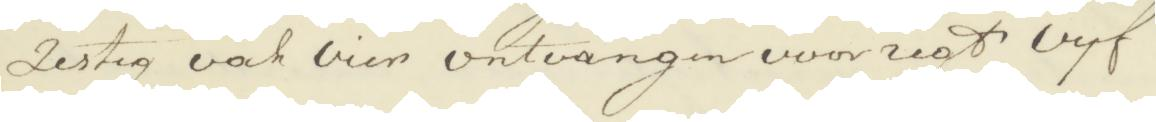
Zestig vak vier ontvangen voor regt vyf
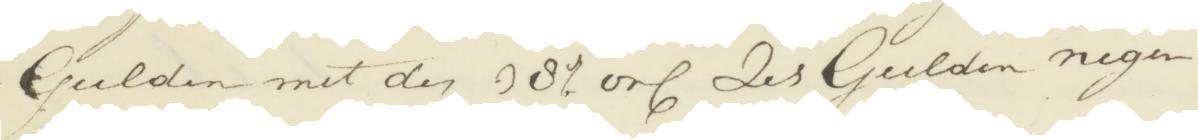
Gulden met den 38% opc Zes Gulden negen
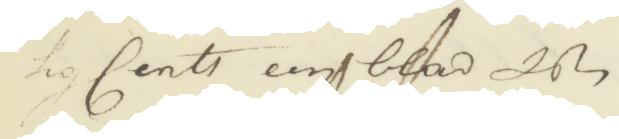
tig Cents een blad ZR
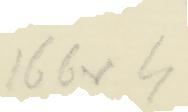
166v 4
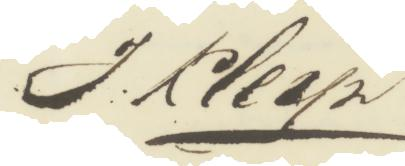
I: Kleyn
